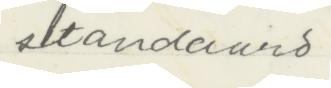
standaard
